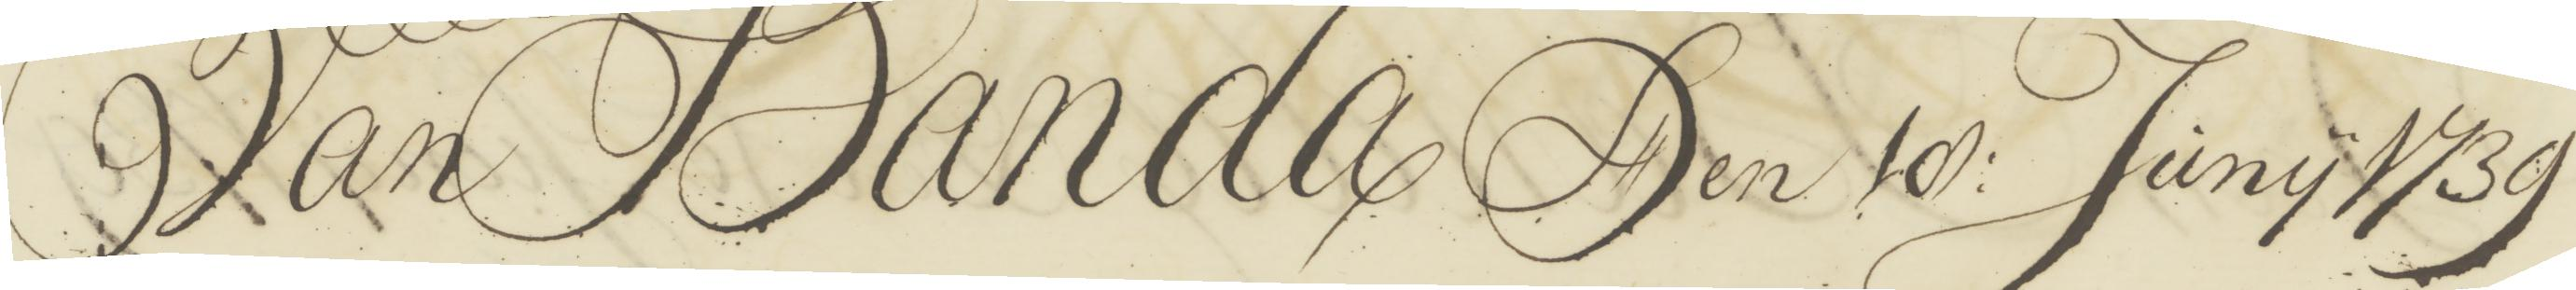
Van Banda Den 18: Junij 1739
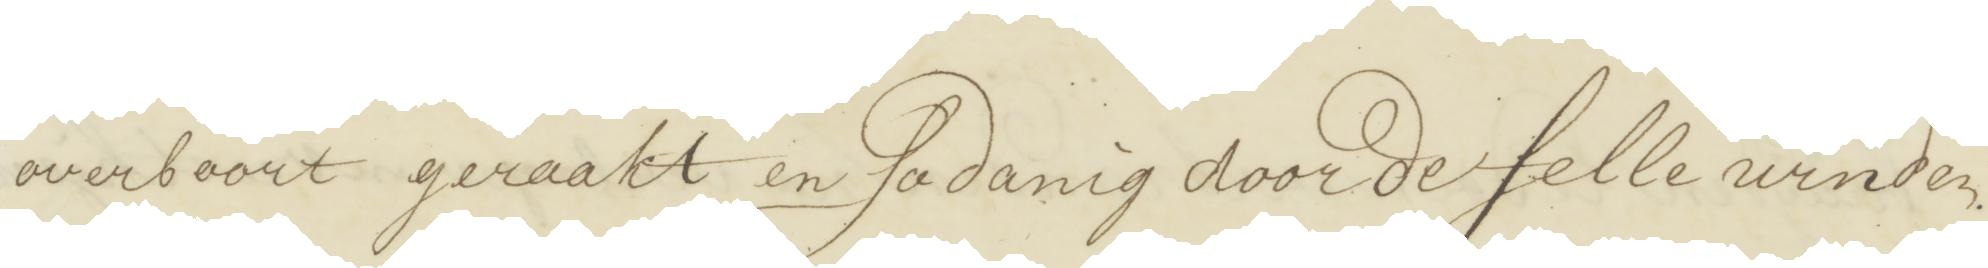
overboort geraakt en sodanig door de felle winden
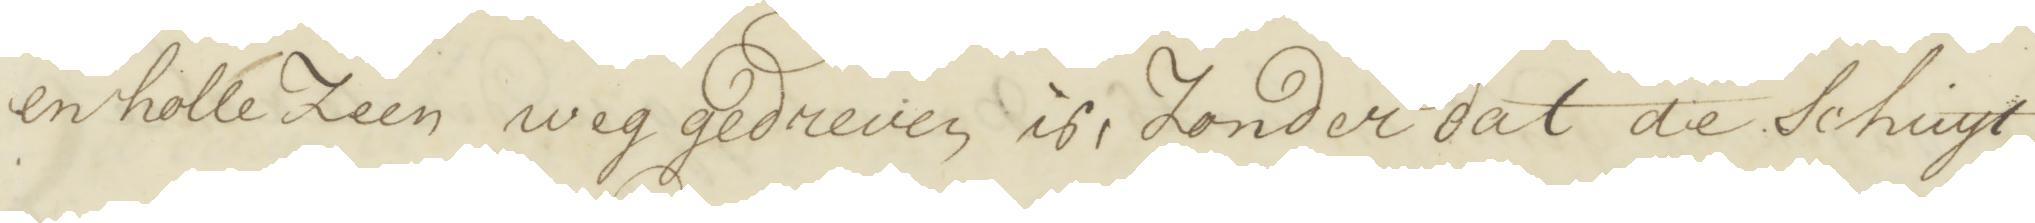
en holle zeen weg gedreven is, zonder dat de schuyt
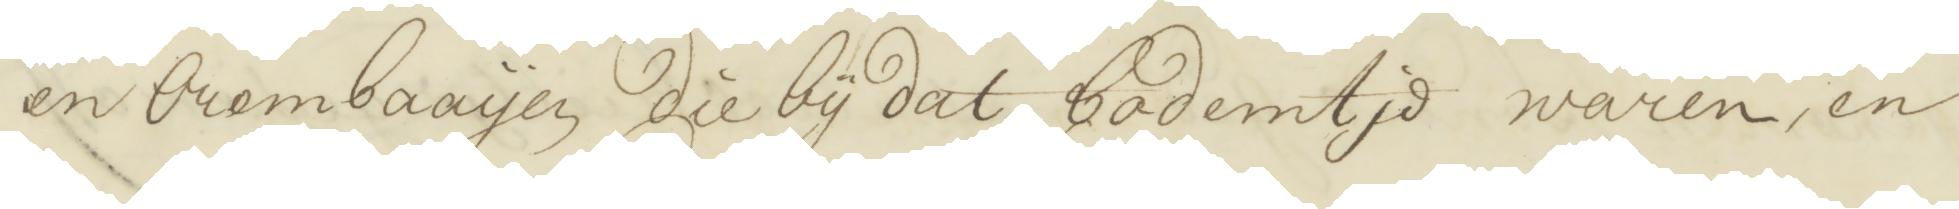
en Orembaaijen die bij dat bodemtje waren, en
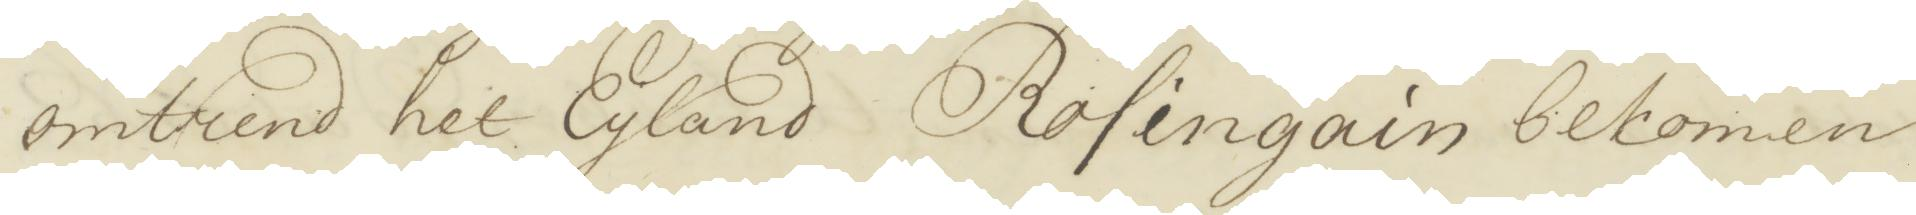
omtrend het Eijland Rosingain bekomen
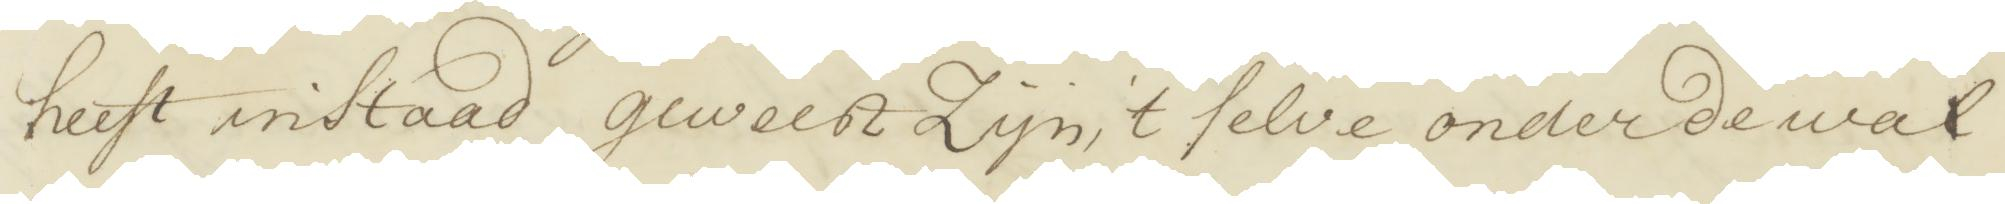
heeft instaad geweest zijn, ’t selve onder de wal
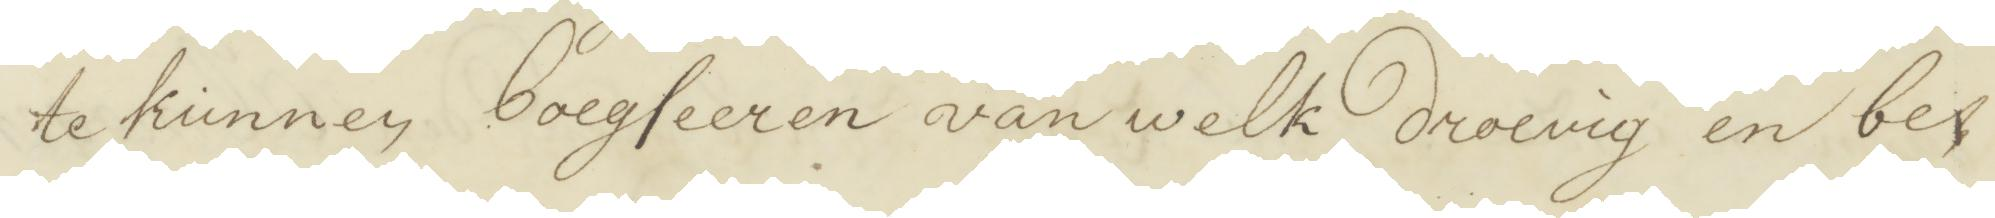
te kunnen boegseeren van welk droevig en be
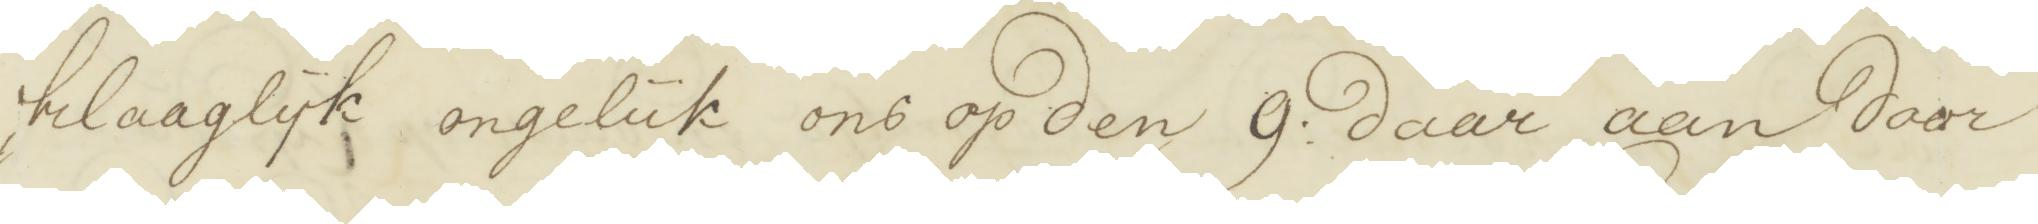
klaaglijk ongeluk ons op den 9: daar aan door
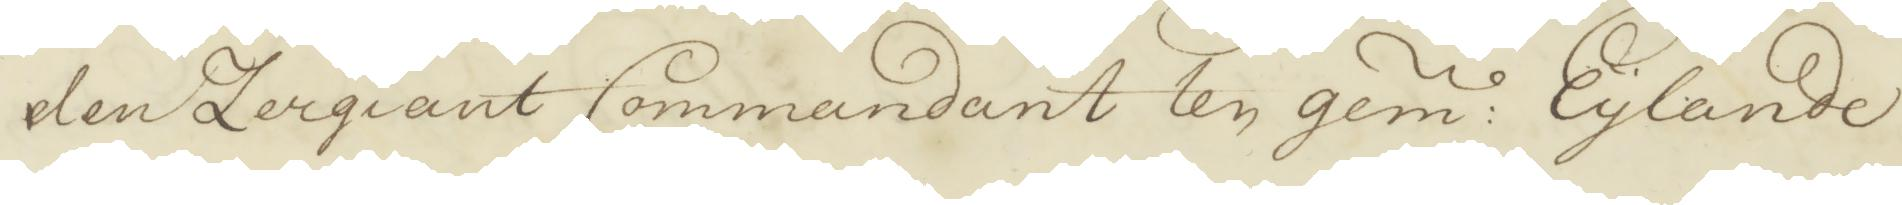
den Zergiant Commandant ten gem:e Eijlande
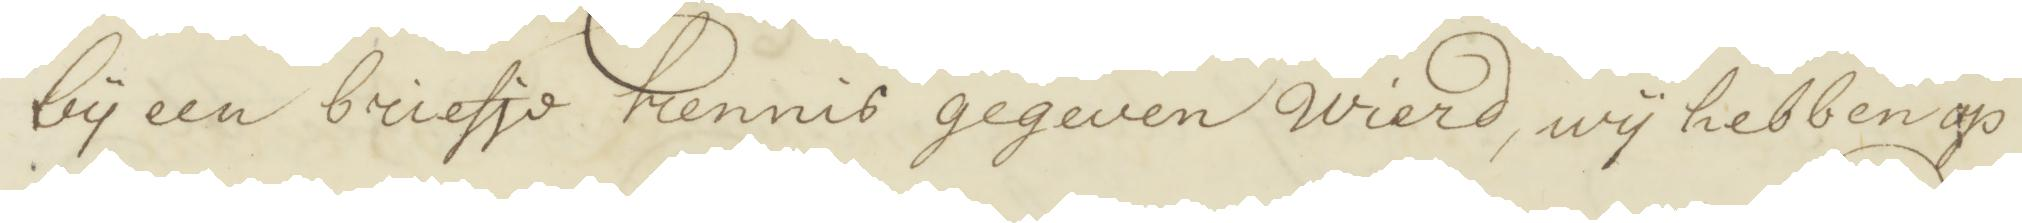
bij een briefje kennis gegeven wierd, wij hebben op
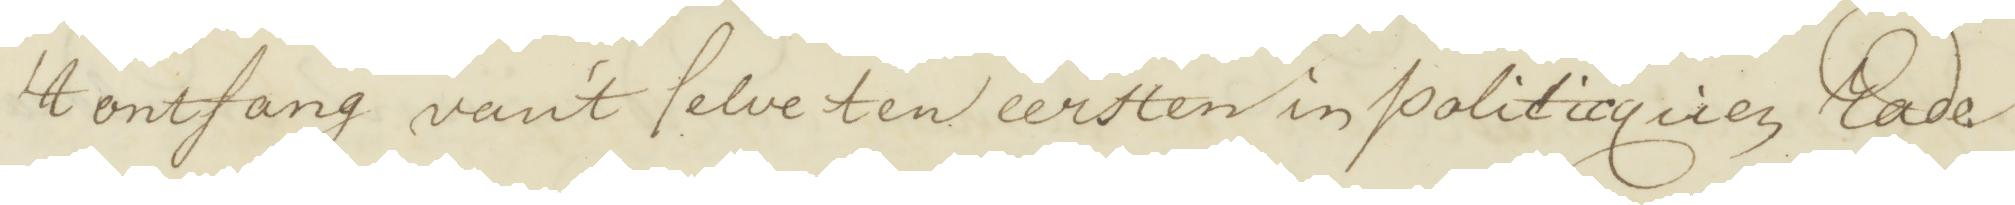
’t ontfang van’t selve ten eersten in politicquen Rade
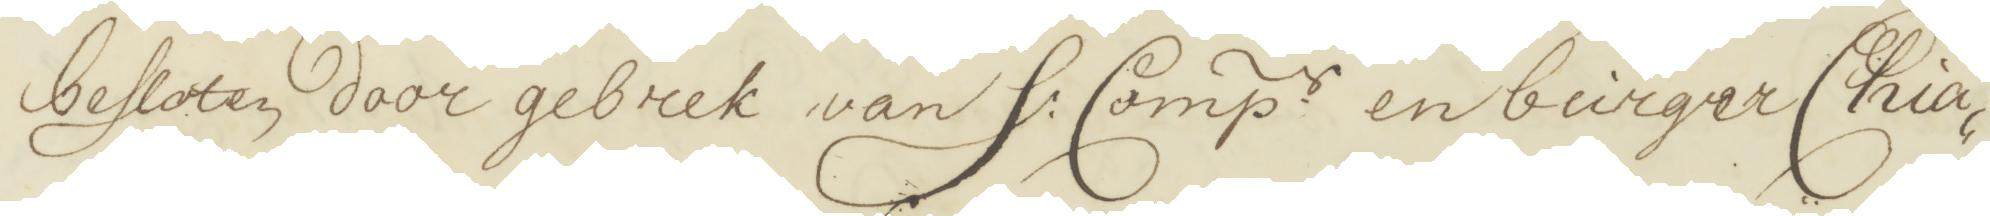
besloten door gebrek van s: Comp:s en burger Chia„
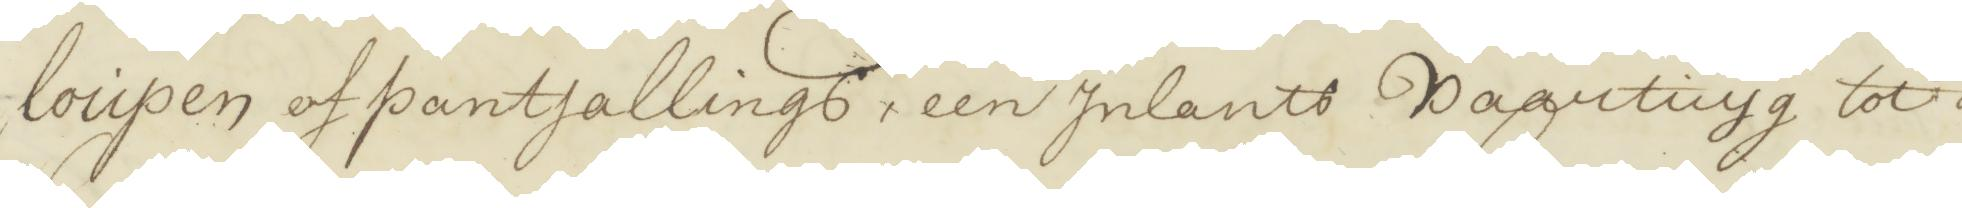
„loupen of pantjallings, een Jnlants Vaartuijg tot
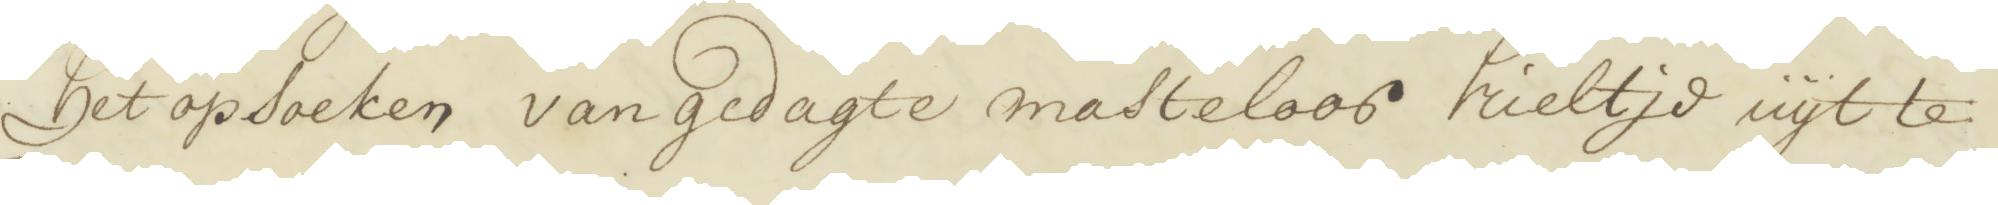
het opsoeken van gedagte masteloos kieltje uijt te
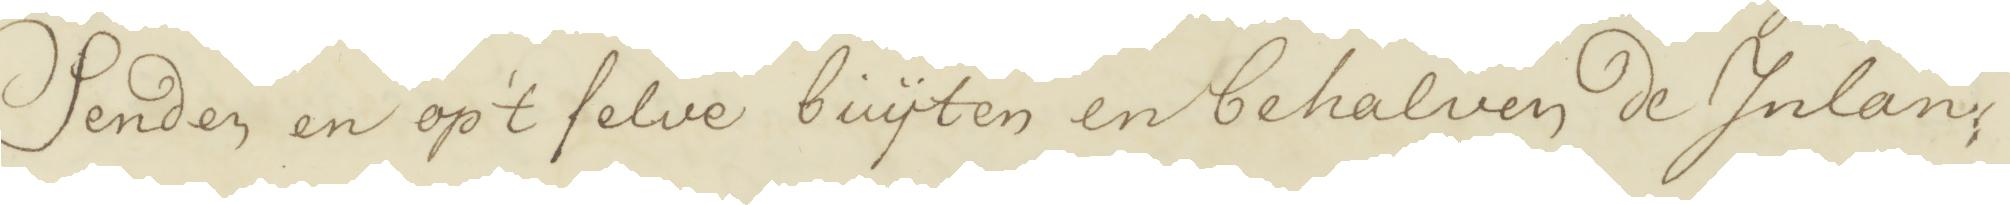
Senden en op ’t selve buijten en behalven de Jnlan„
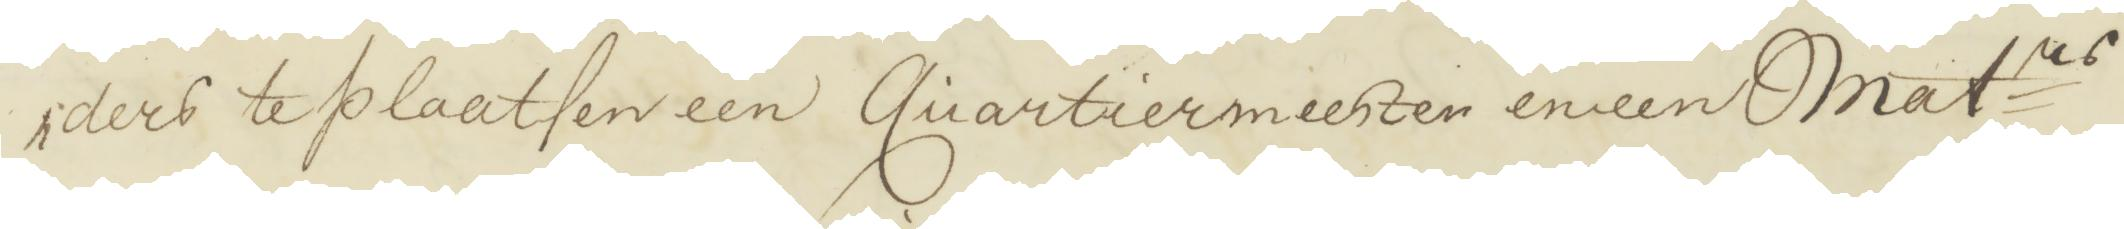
„ders te plaatsen een Quartiermeester en een Mat=rs
